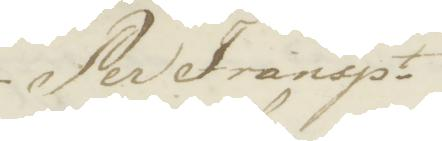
Per Transp-t
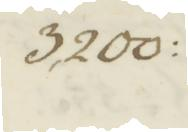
3,200:
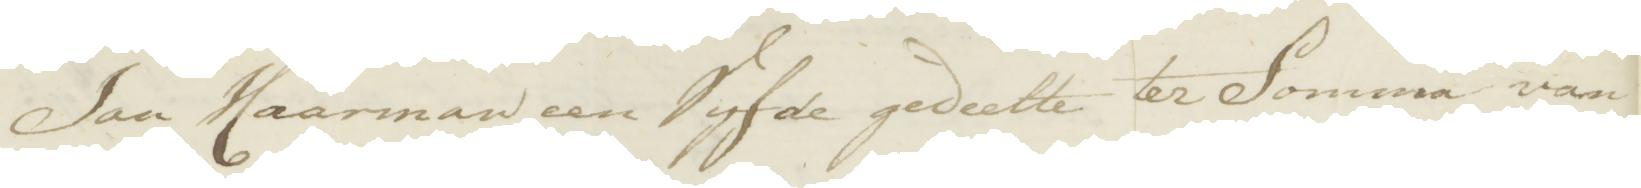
Jan Haarman een Vyfde gedeelte ter Somma van
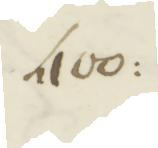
400:
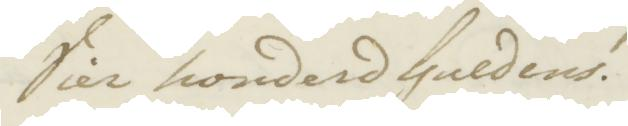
Vier honderd Guldens.
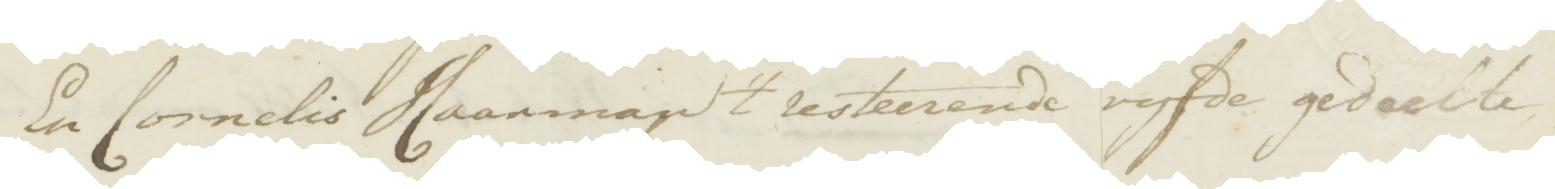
En Cornelis Haarman ’t resteerende vyfde gedeelte
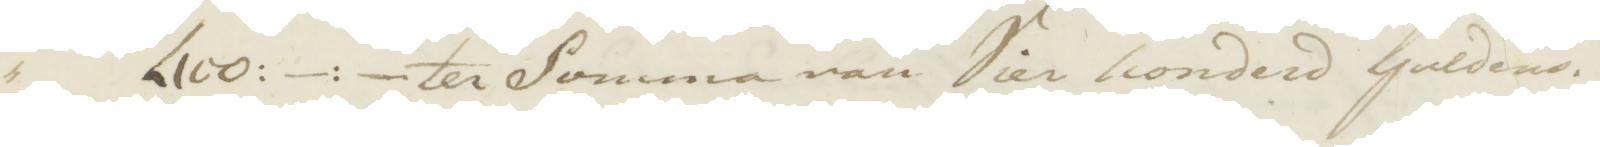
„ 400: —: — ter Somma van Vier honderd Guldens.
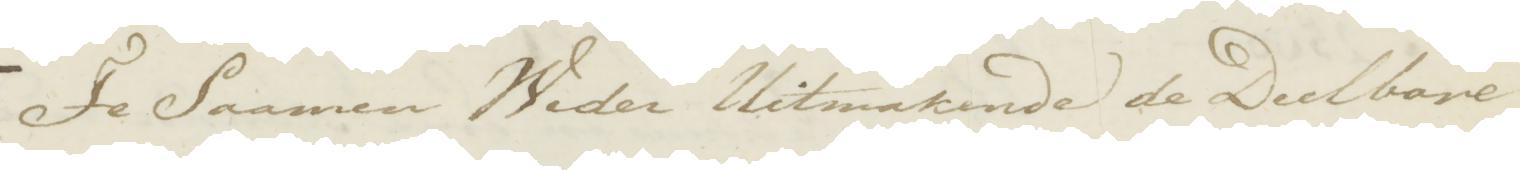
Te Saamen Weder Uitmakende de Deelbare
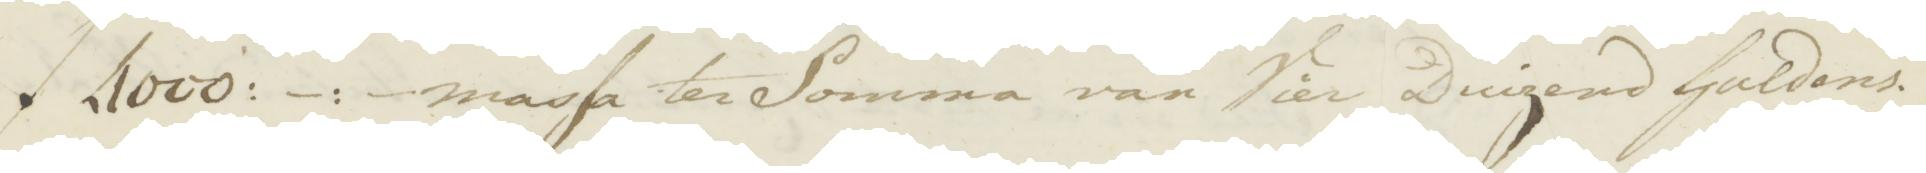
ƒ 4000: —: — massa ter Somma van Vier Duizend Guldens.
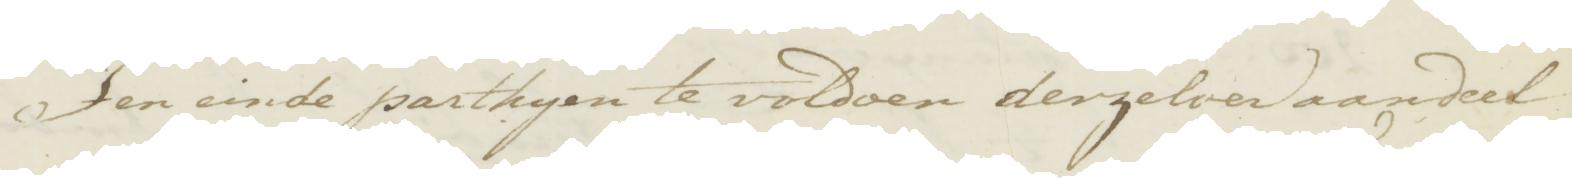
Ten einde parthyen te voldoen derzelver aandeel
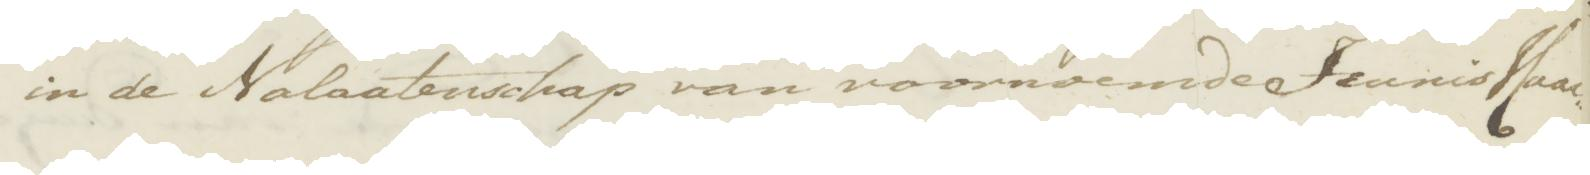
in de Nalaatenschap van voornoemde Teunis Haar„
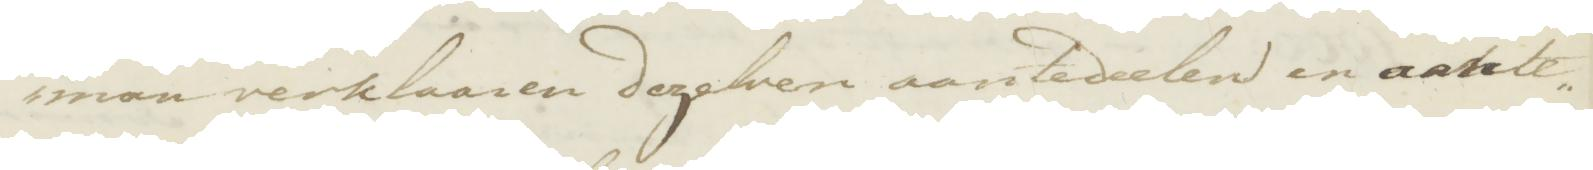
„man verklaaren dezelven aantedeelen en acte te„
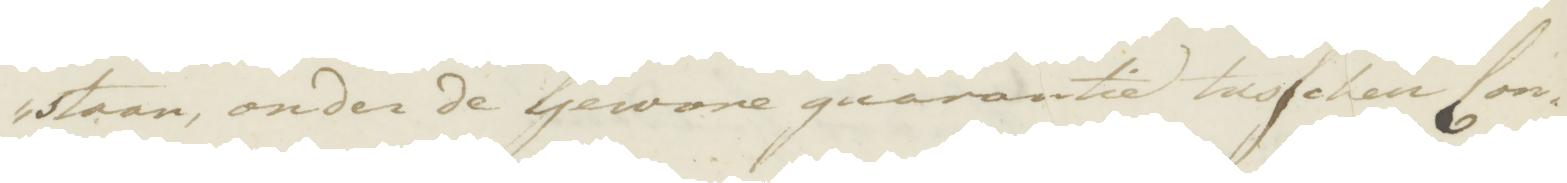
„staan, onder de Gewone gaarantie tusschen Con„
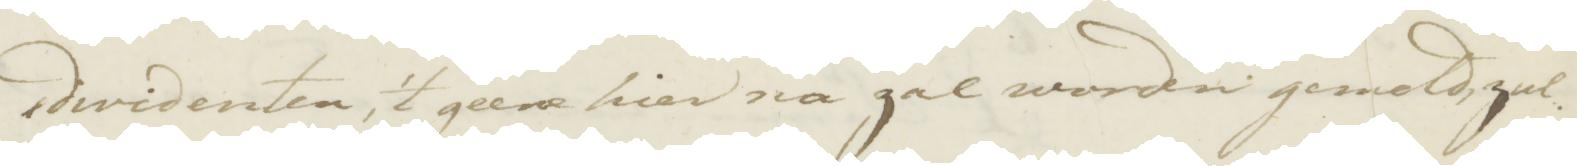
dividenten, ’t geene hier na zal worden gemeld, zul„
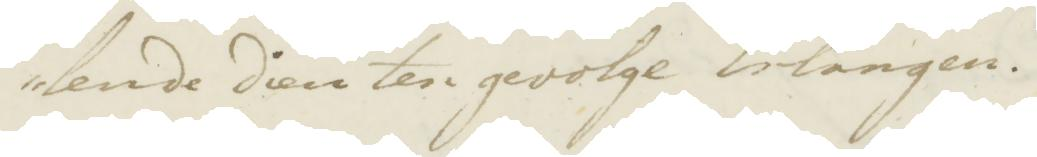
„lende dien ten gevolge Erlangen.
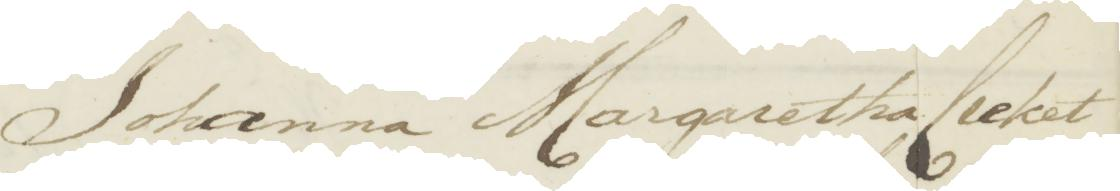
Johanna Margaretha Cicket
